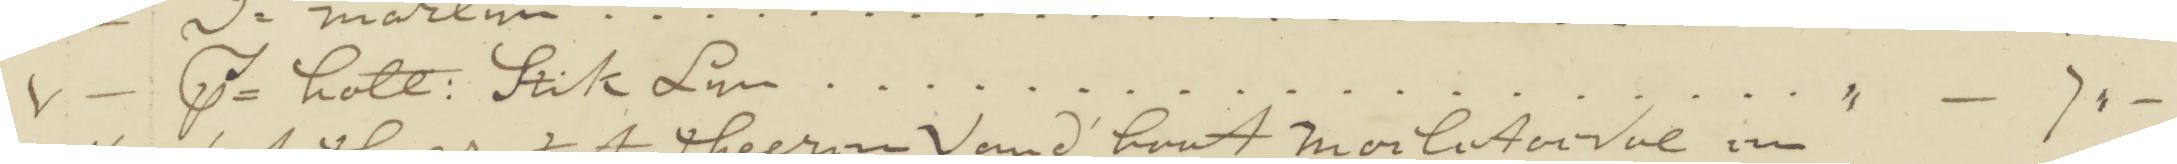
1 — p=s holl: stik Lyn . . . . . . . . . . . . . . . . . . . . „ — 7„—
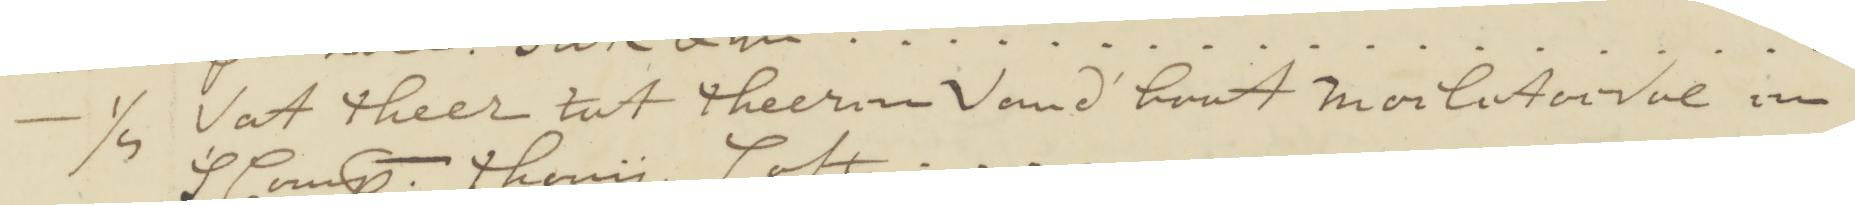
— 1/9 vat theer tot theeren van d’ boot moeletoeval en
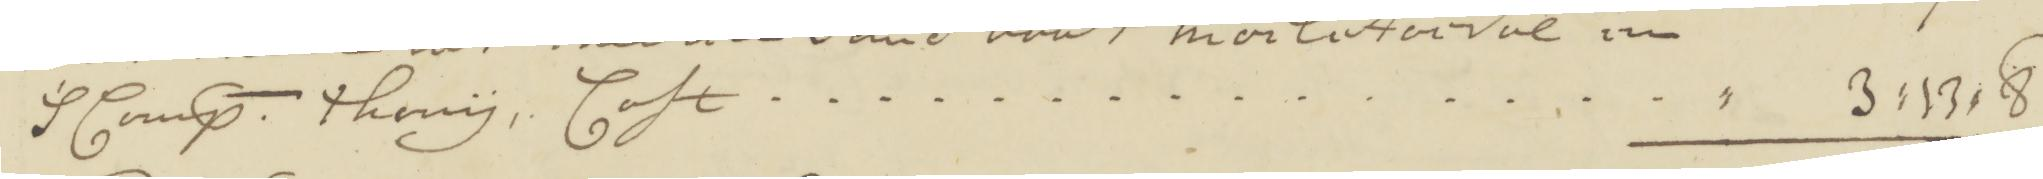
's Comp.- thonij, Cost . . . . . . . . . . . . . . . . „ 3 „13„ 8
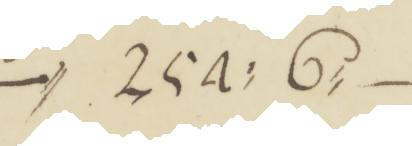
„ 254„ 6„ -
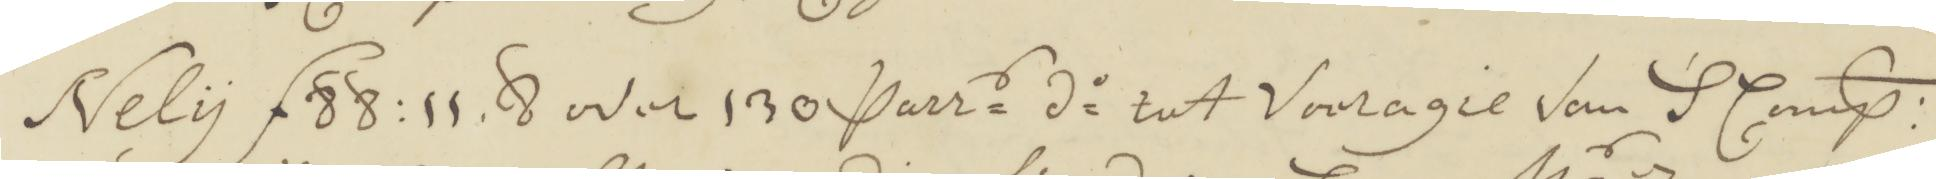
Nelij ƒ88:11. 8 over 130 parr=s d=o tot voeragie van ’s Comp:
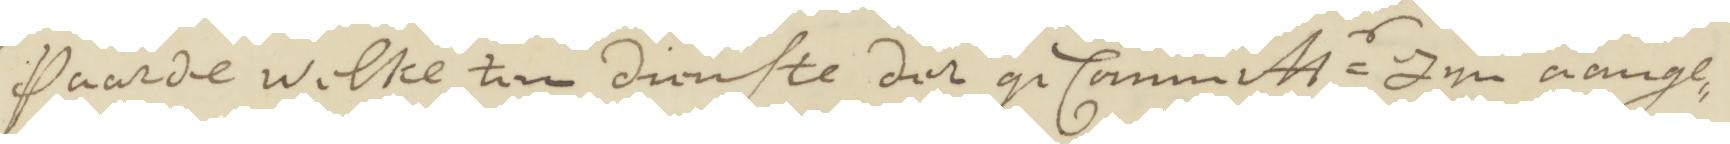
paarde welke ten dienste der gecommitt=s zyn aange„
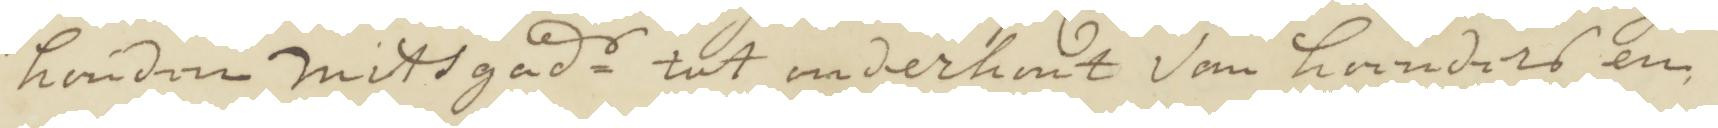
houden mitsgad=s tot onderhout van hoenders en
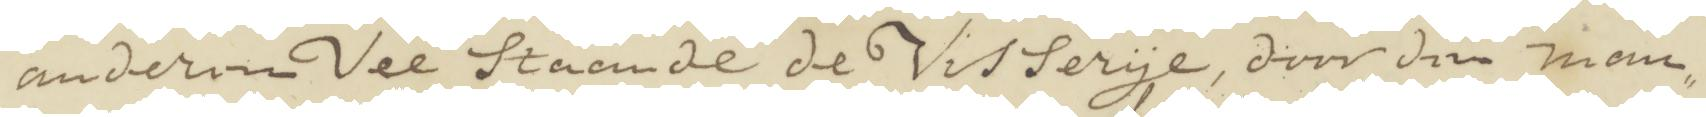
anderen Vee staande de Visserije, door den mom„
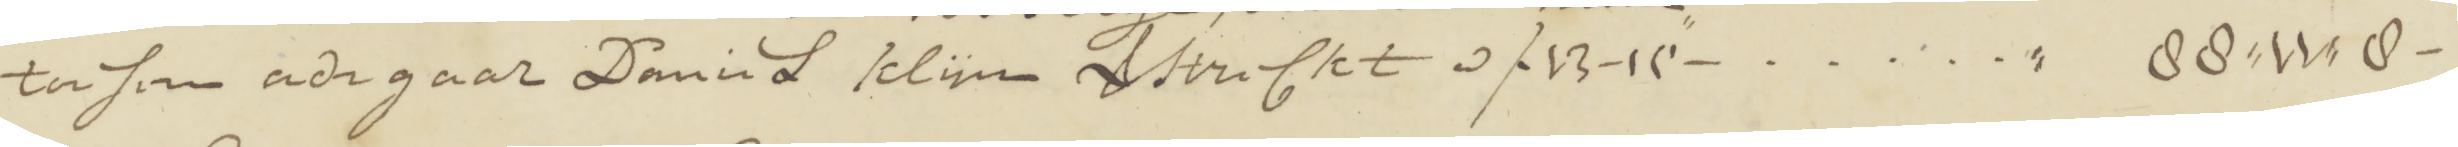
tasen adigaar Daniel klijn verstreckt a ƒ13-15— . . . . . „ 88„11„8—
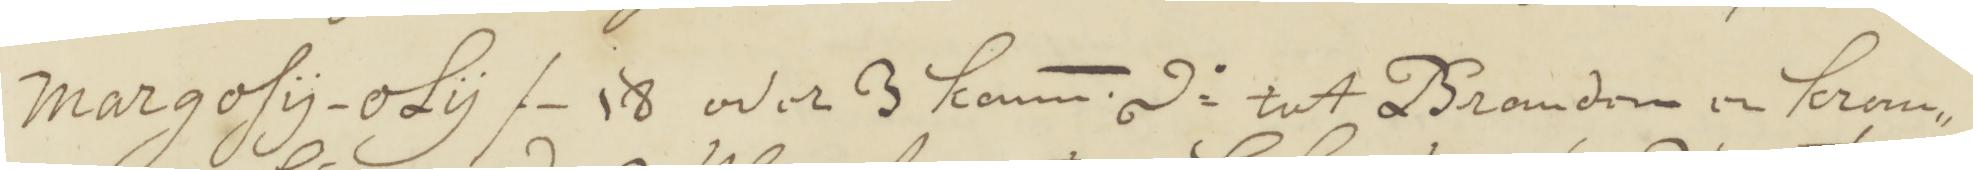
Margosij-olij ƒ— 18 over 3 kann: d=o tot Branden en krom„
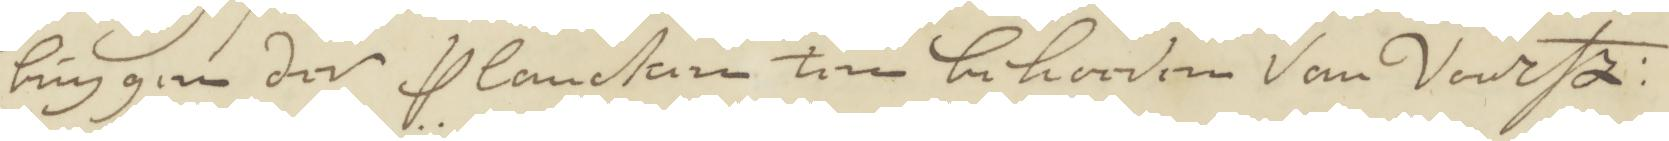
buijgen der plancken ten behoeven van Voorsz:
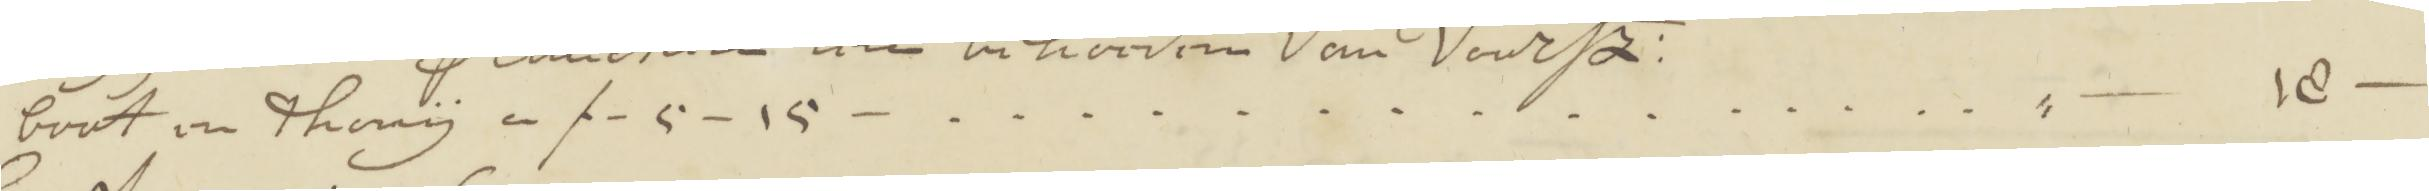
boot en thonij a ƒ- 5 — 15 — . . . . . . . . . . . . . . . „—18 —
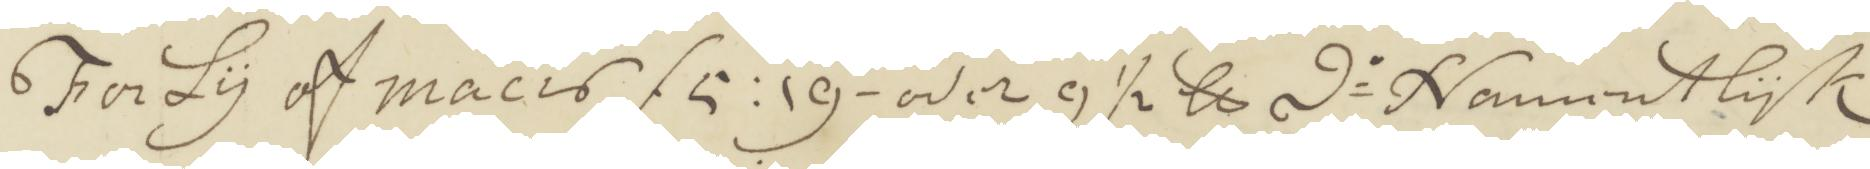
Foelij of macis ƒ 5:19- over 9½ lb d=o Namentlijk
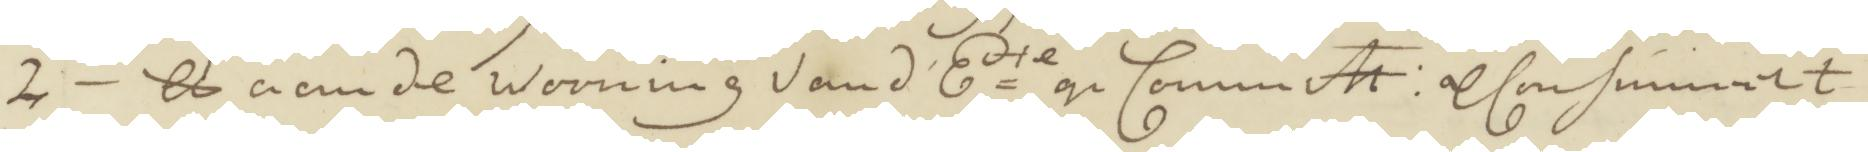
2 — lb aan de wooning van d’ E=te gecommitt: verconsumeert
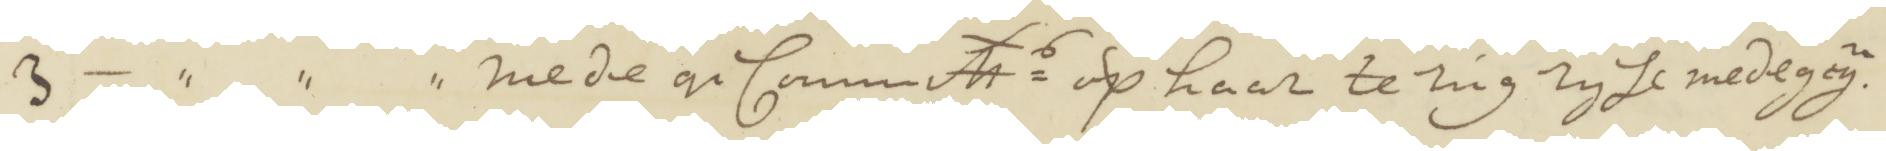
3 — „ „ „ mede gecommitt=s op haar te rug ryse medegeg.n
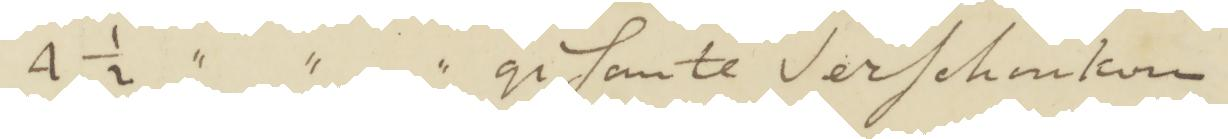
4½ „ „ „ gesante verschonken
